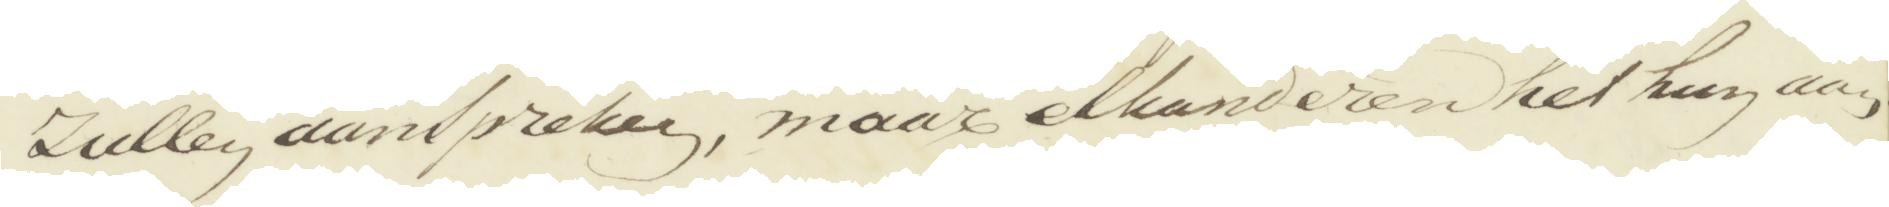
zullen aanspreken, maar elkanderen het hun aan
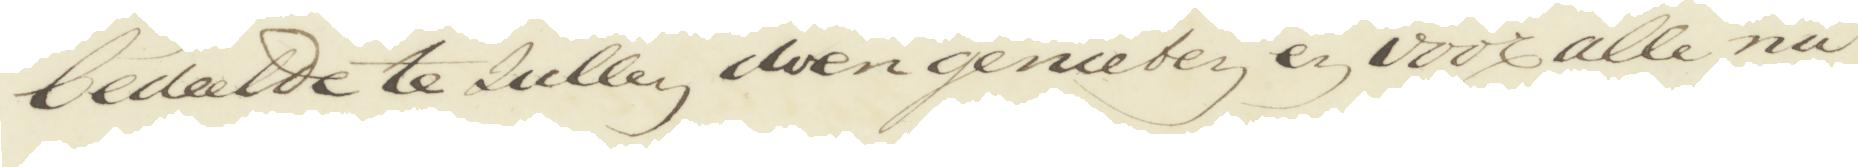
bedeelde te zullen doen genieten en voor alle na
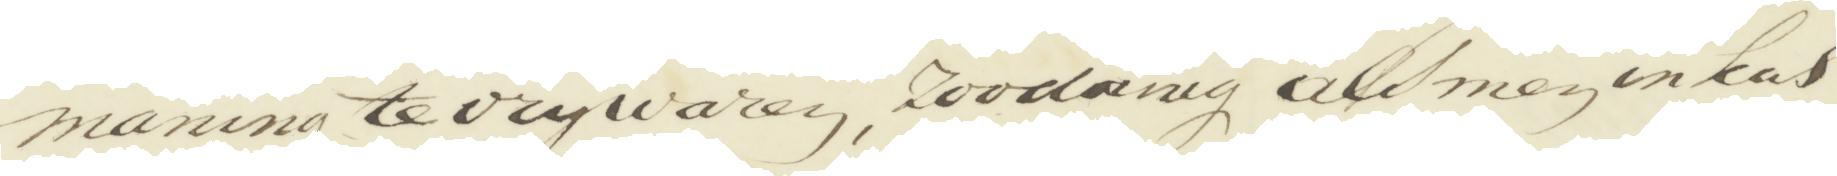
maning te vrywaren, zoodanig als men in kas
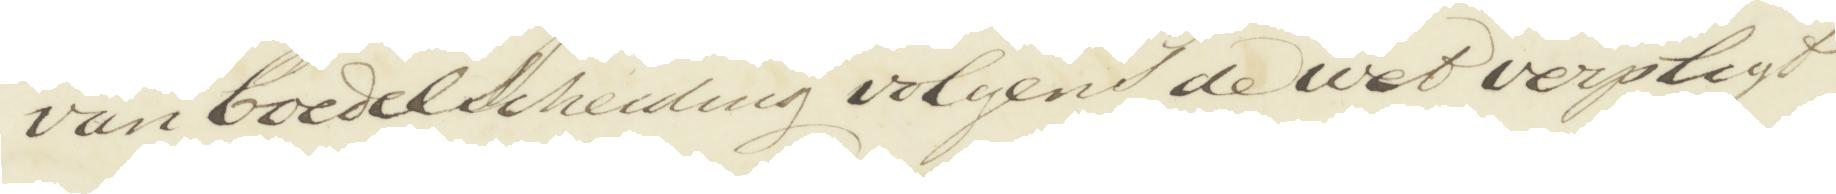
van boedelscheiding volgens de wet verpligt
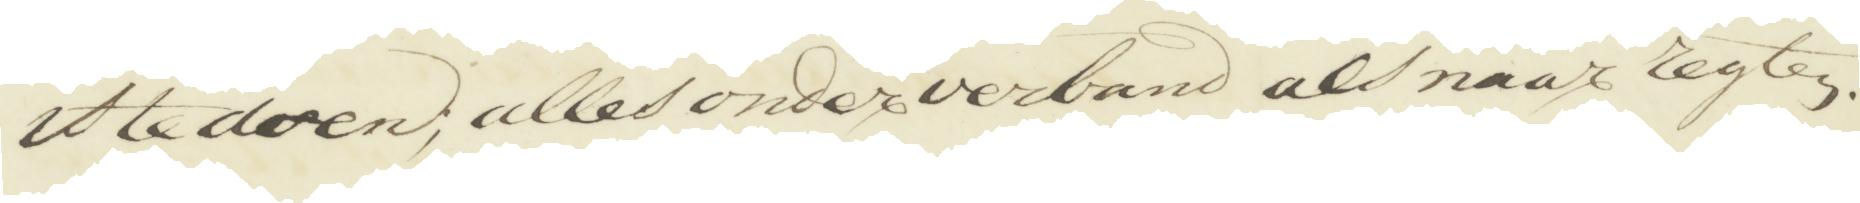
is te doen, alles onder verband als naar regten,
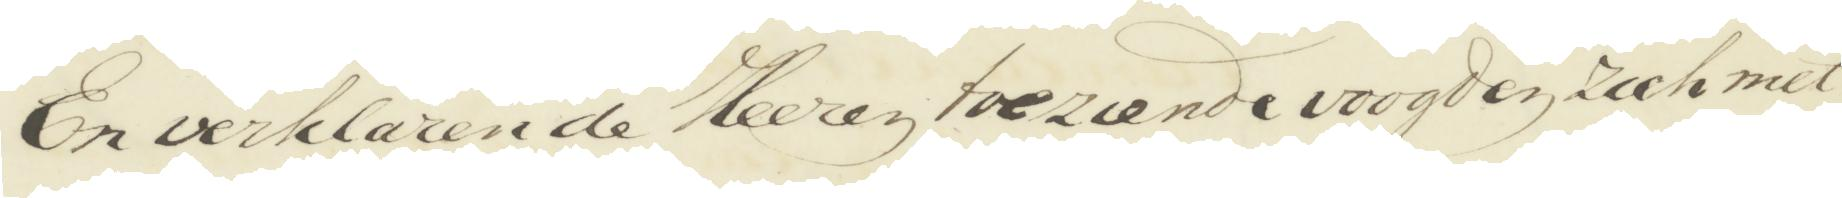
En verklaren de Heeren toeziende voogden zich met
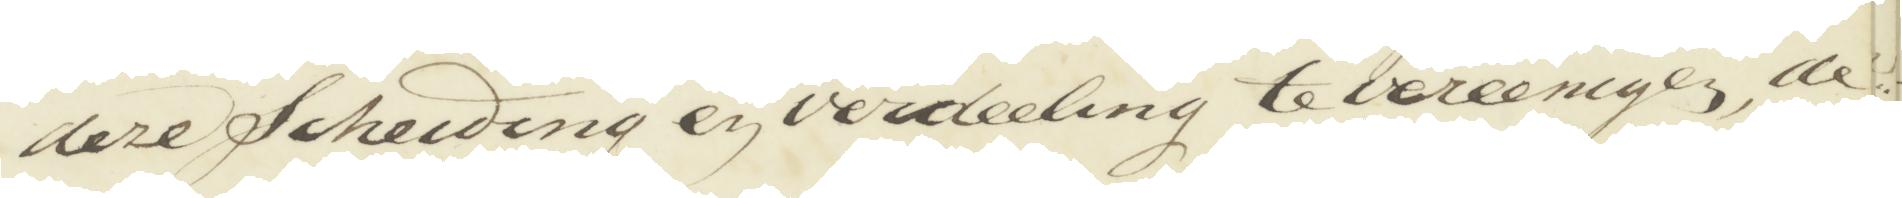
deze Scheiding en verdeeling te vereenigen, de
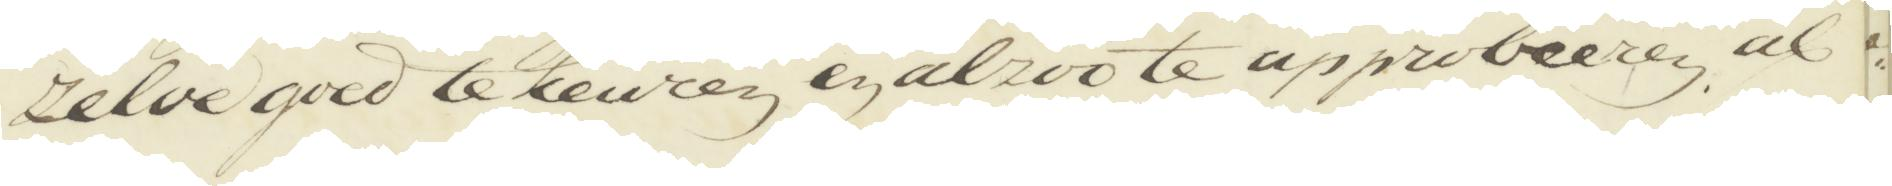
zelve goed te keuren en alzoo te approbeeren al
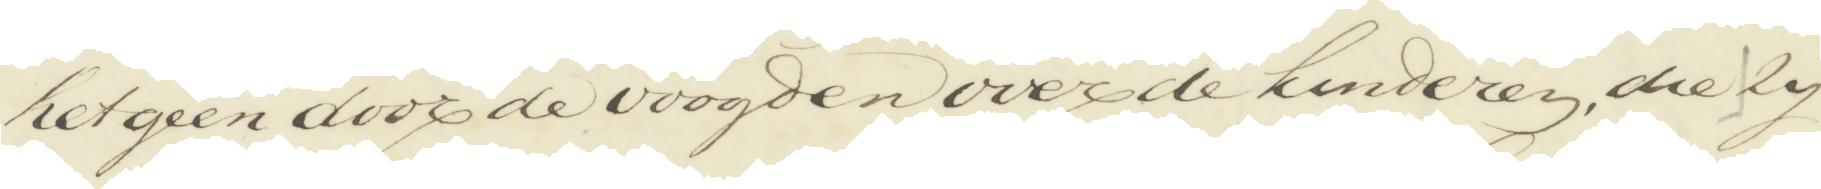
hetgeen door de voogden over de kinderen, die zy
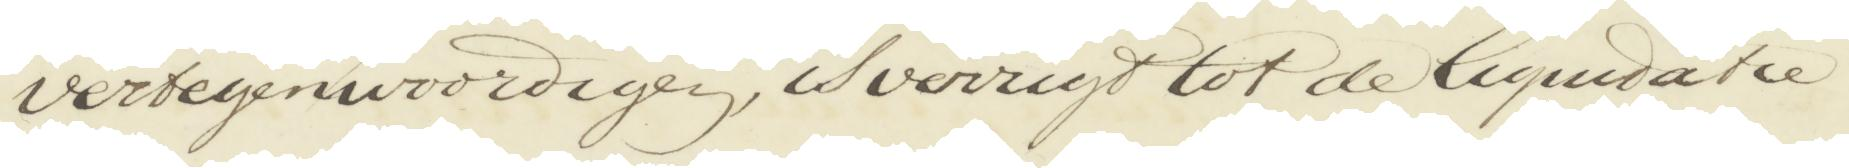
vertegenwoordigen, is verrigd tot de liquidatie
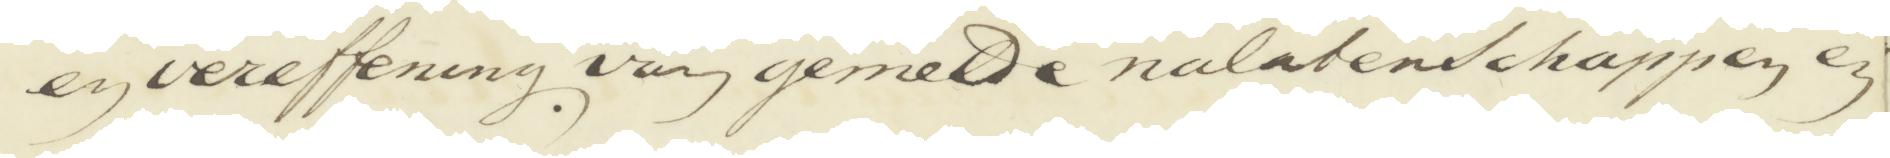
en vereffening van gemelde nalatenschappen en
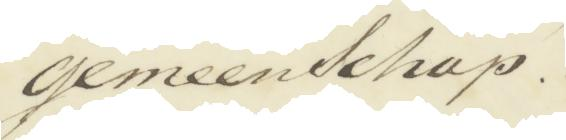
gemeenschap.
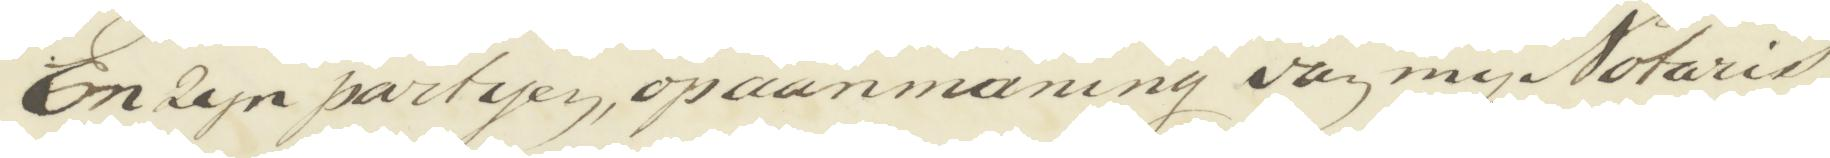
En zyn partyen, op aanmaning van my Notaris,
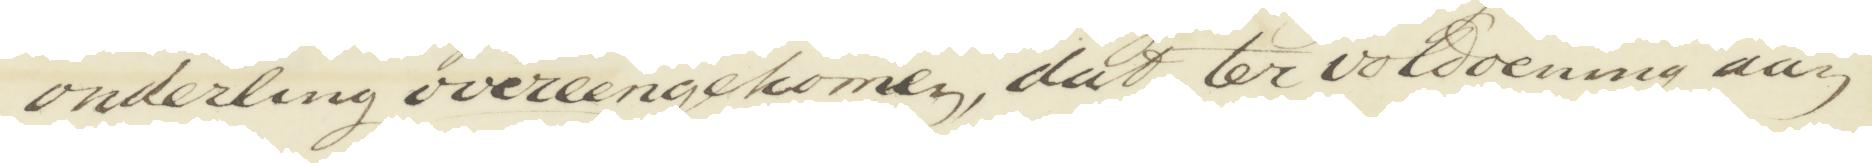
onderling overeengekomen, dat, ter voldoening aan
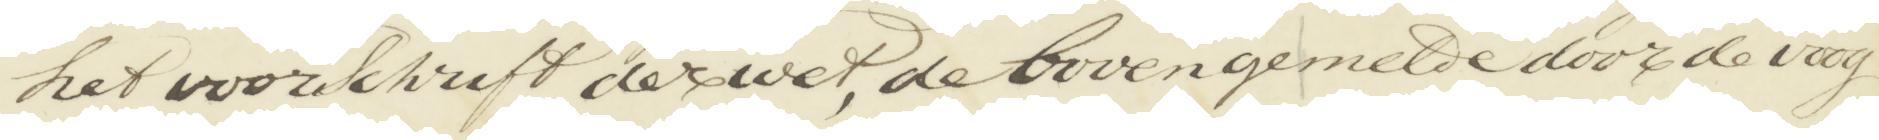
het voorschrift der wet de bovengemelde door de voog
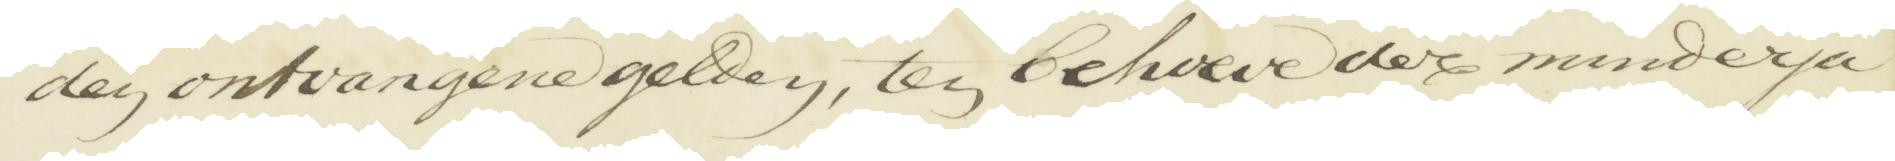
den ontvangene gelden, ten behoeve der minderja
